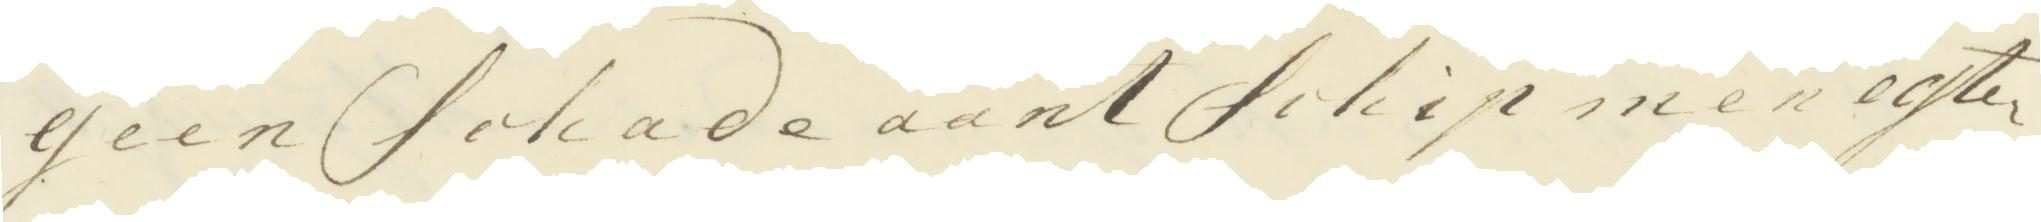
geen schade aan't schip men egter
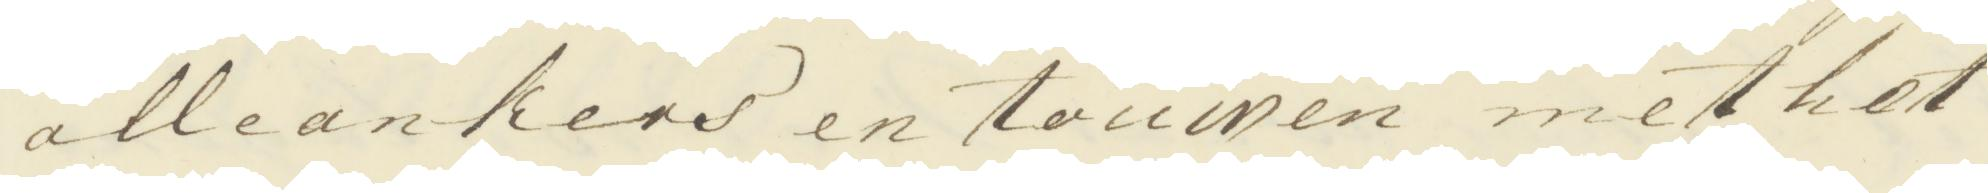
alle ankers en touwen met het
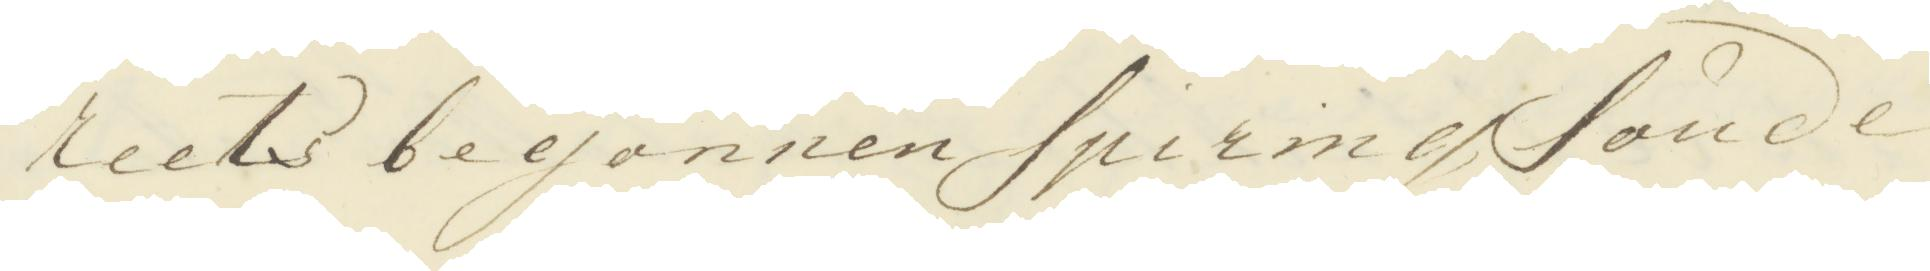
reets begonnen spiring soude
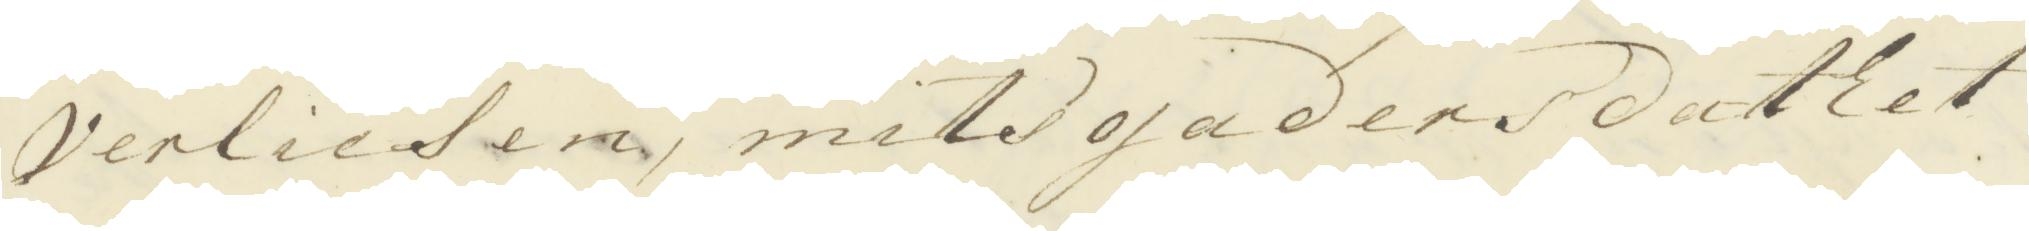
verliesen, mitsgaders dat het
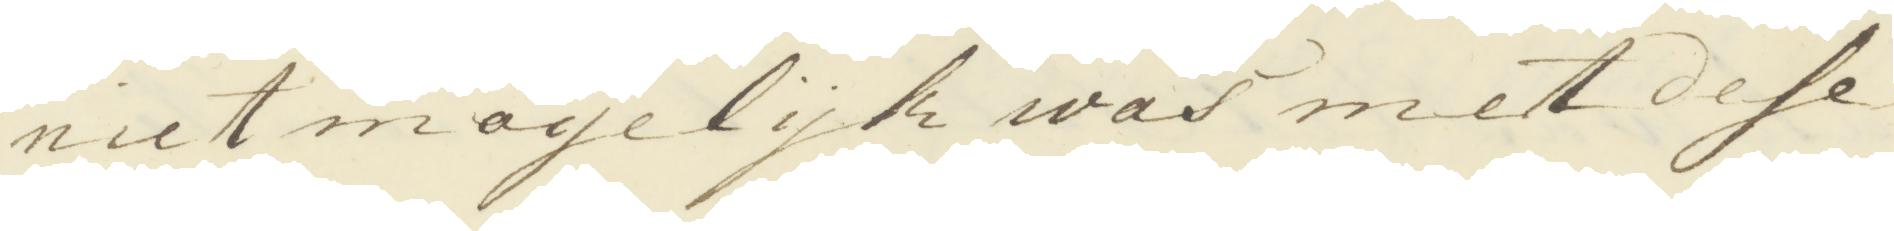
niet mogelijk was met dese
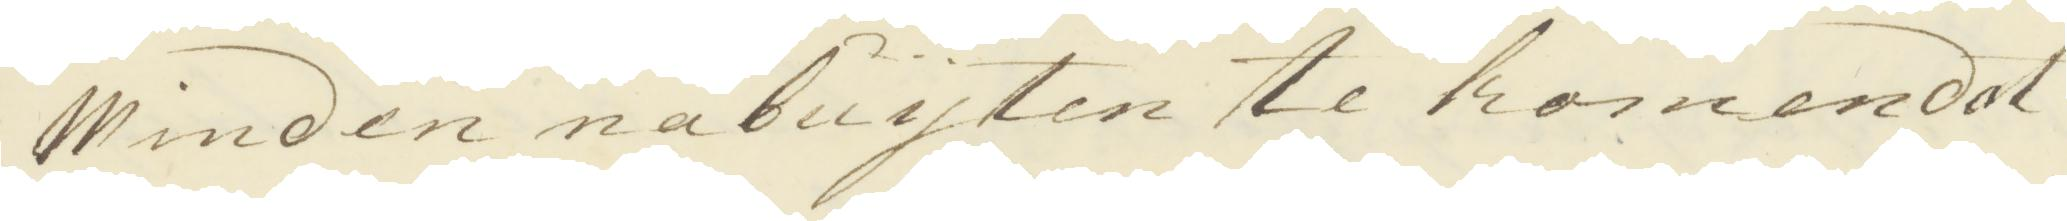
winden na buijten te komen dat
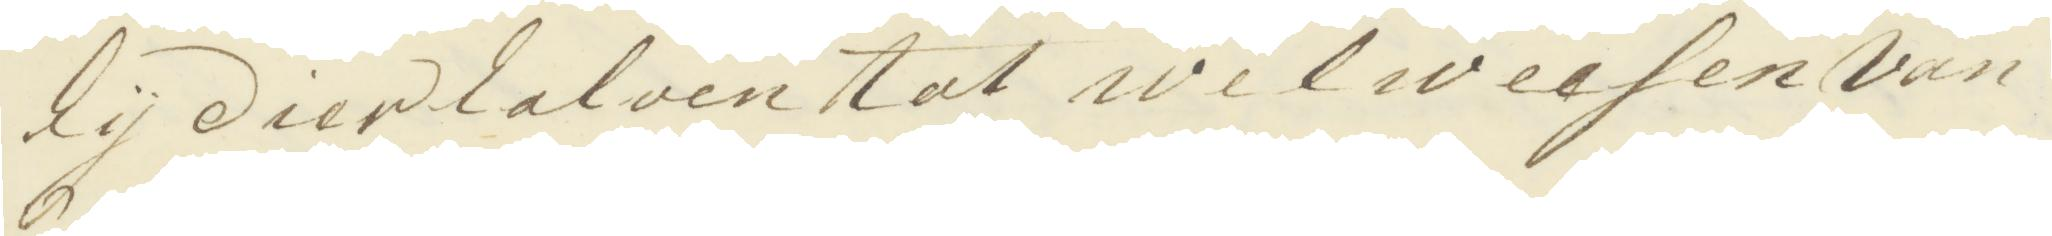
zij dier halven tot welweesen van
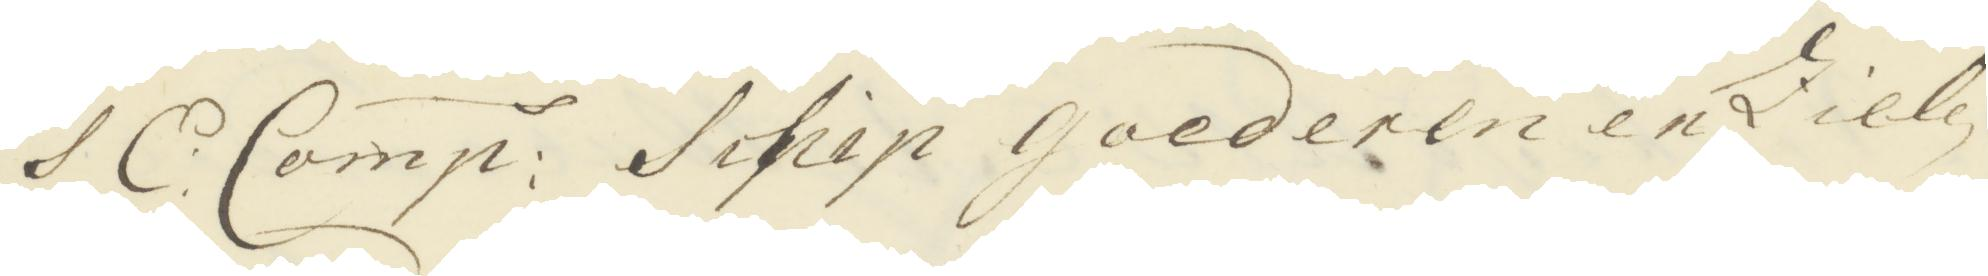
's E: Comp:s schip goederen en zielen
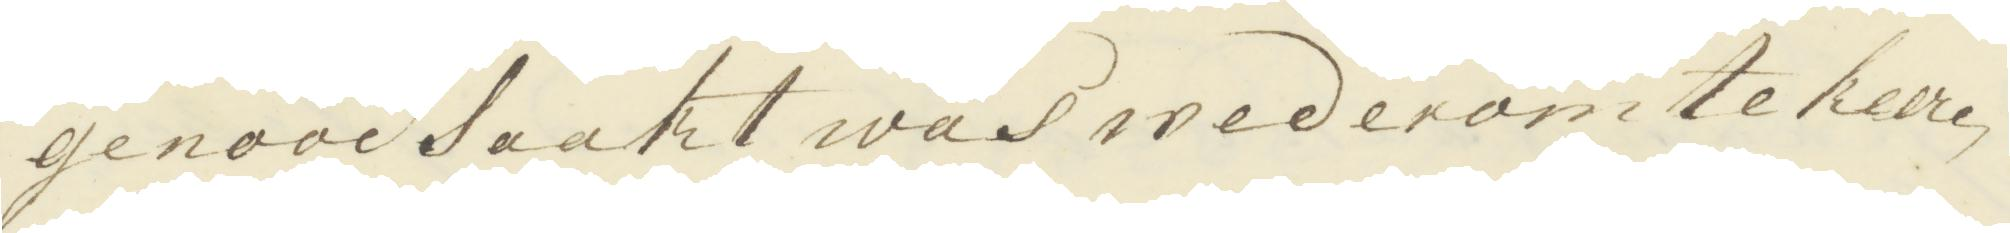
genoodsaakt was wederom te keeren
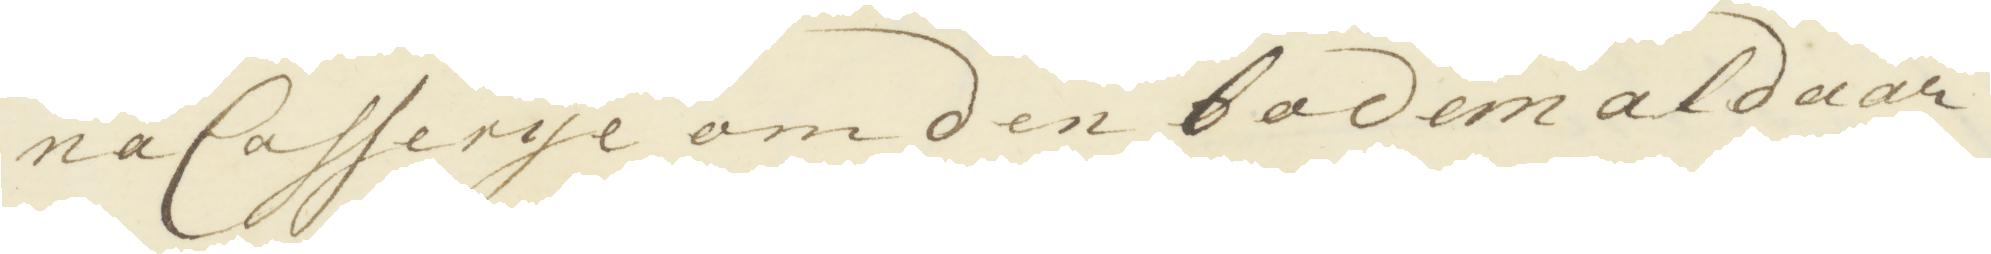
na Casserije om den bademaldaar
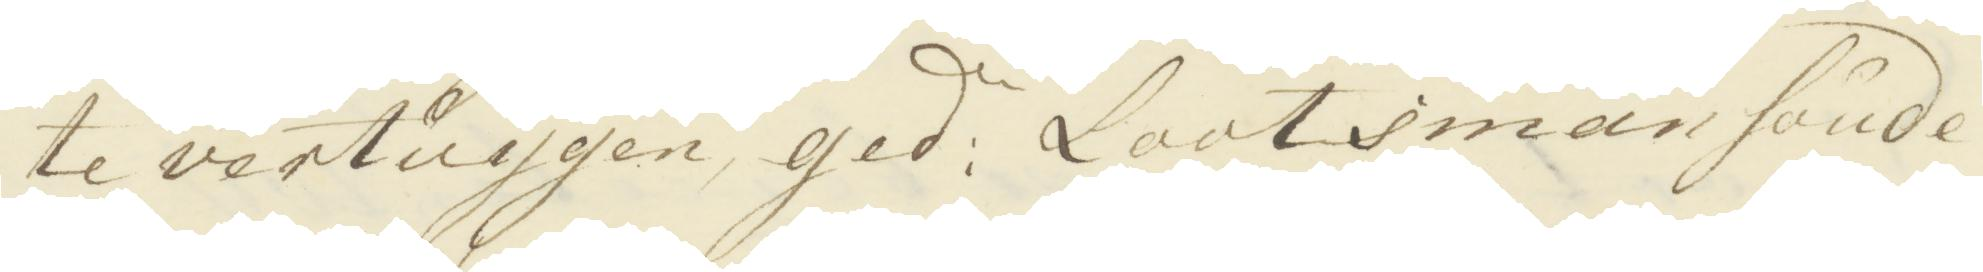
te vertuijgen, ged:n Lootsman soude
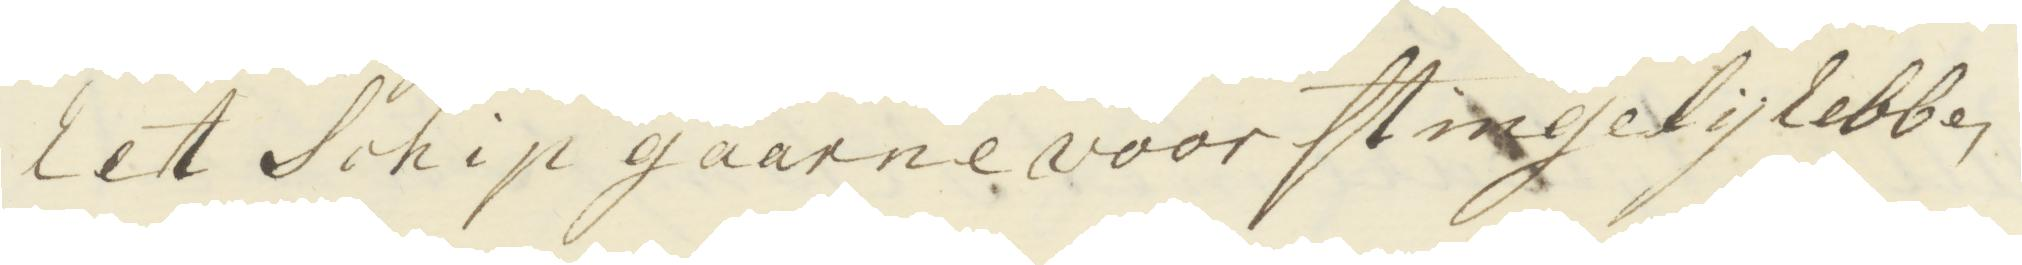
het schip gaarne voor stingelij hebben
